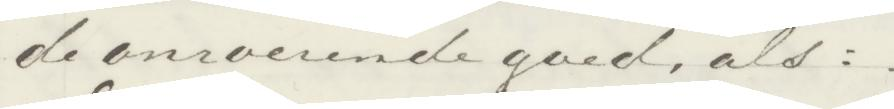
de onroerende goed, als:
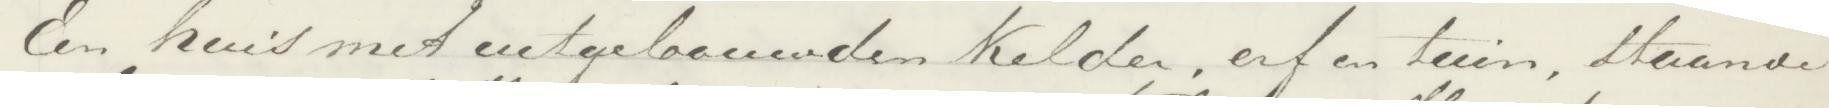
Een huis met uitgebouwden kelder, erf en tuin, staande
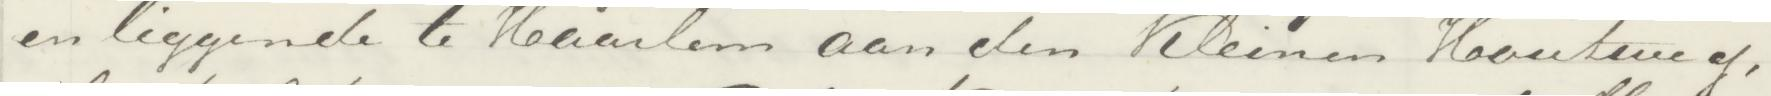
en liggende te Haarlem aan den Kleinen Houtweg,
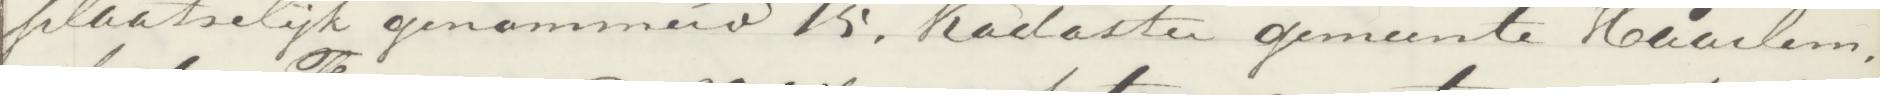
plaatselijk genommerd 15, kadaster gemeente Haarlem,
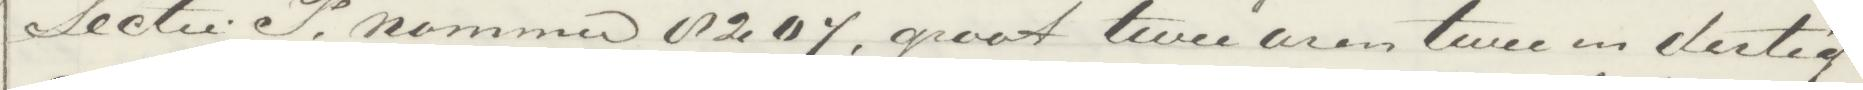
sectie F. nommer 8207, groot twee aren twee en dertig
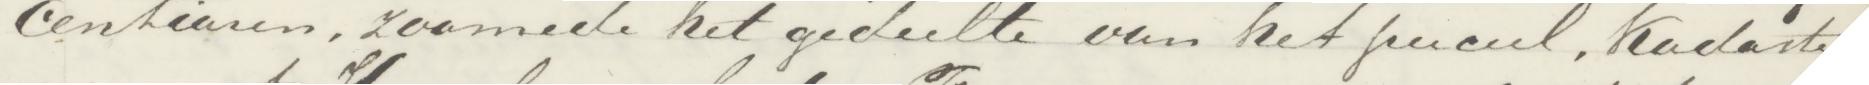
centiaren, zoomede het gedeelte van het perceel, kadaster
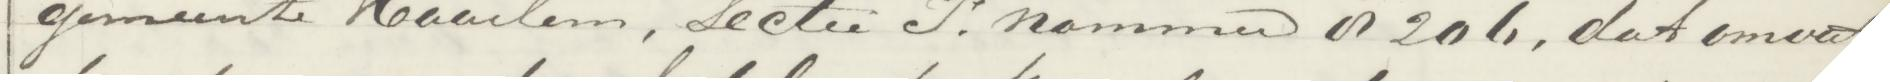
gemeente Haarlem, sectie F. nommer 8206, dat omvat
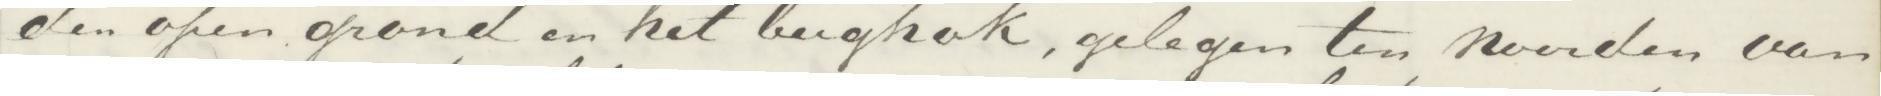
den open grond en het berghok, gelegen ten noorden van
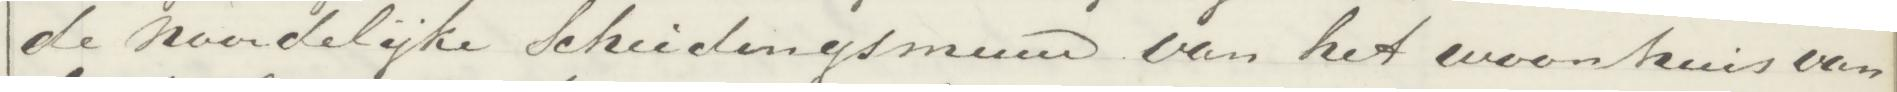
de noordelijke scheidingsmuur van het woonhuis van
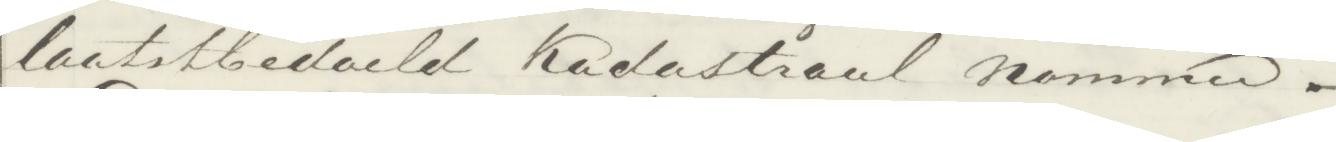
laatstbedoeld kadastraal nommer-
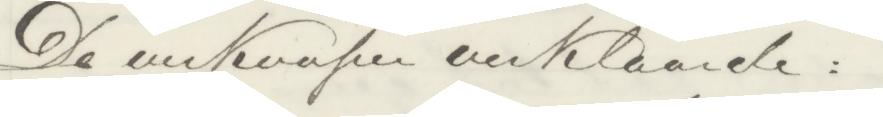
De verkooper verklaarde:
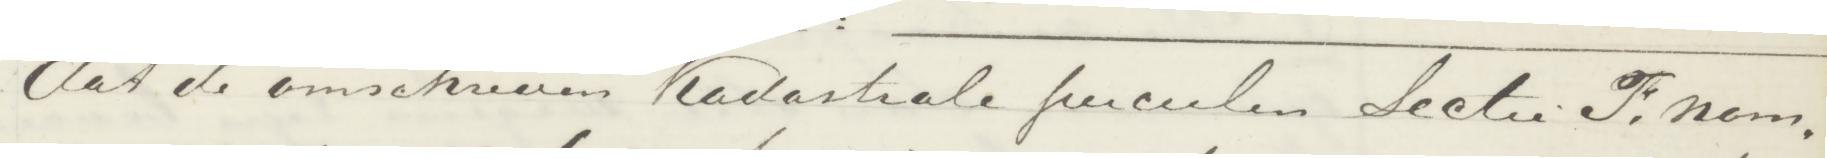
dat de omschreven kadastrale perceelen Sectie F, nom„
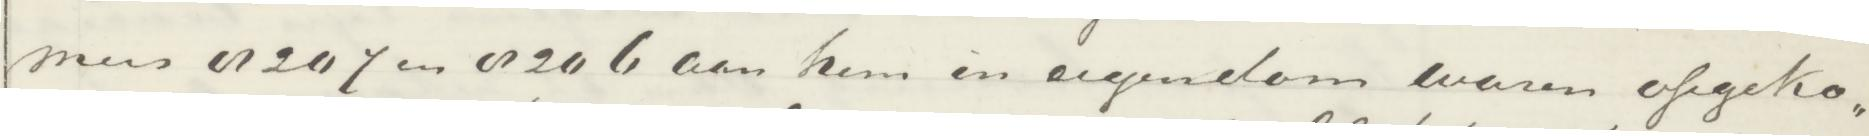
meis 8207 en 8206 aan hem in eigendom waren afgeko„
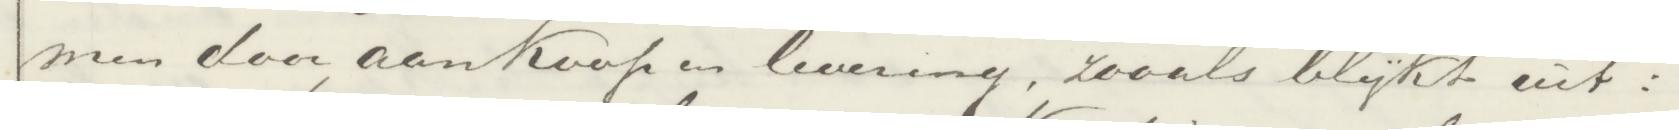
men door aankoop en levering, zooals blijkt uit:
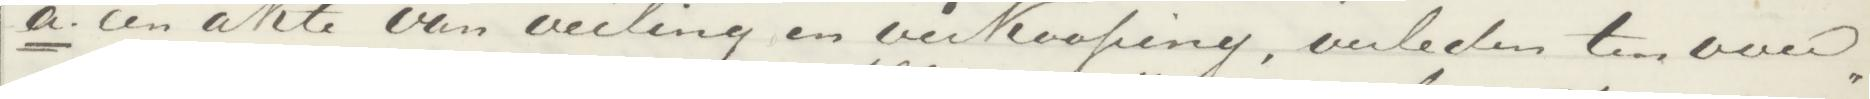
a. een akte van veiling en verkooping, verleden ten over„
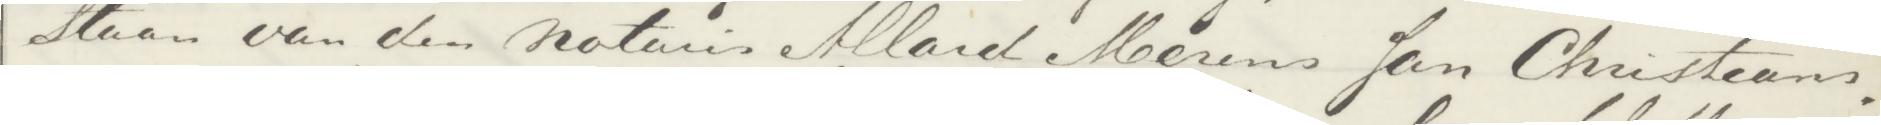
staan van den notaris Allard Merens Jan Christeans„
